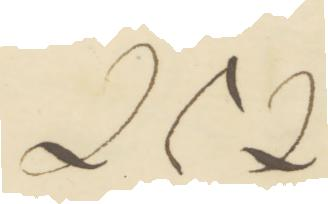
252
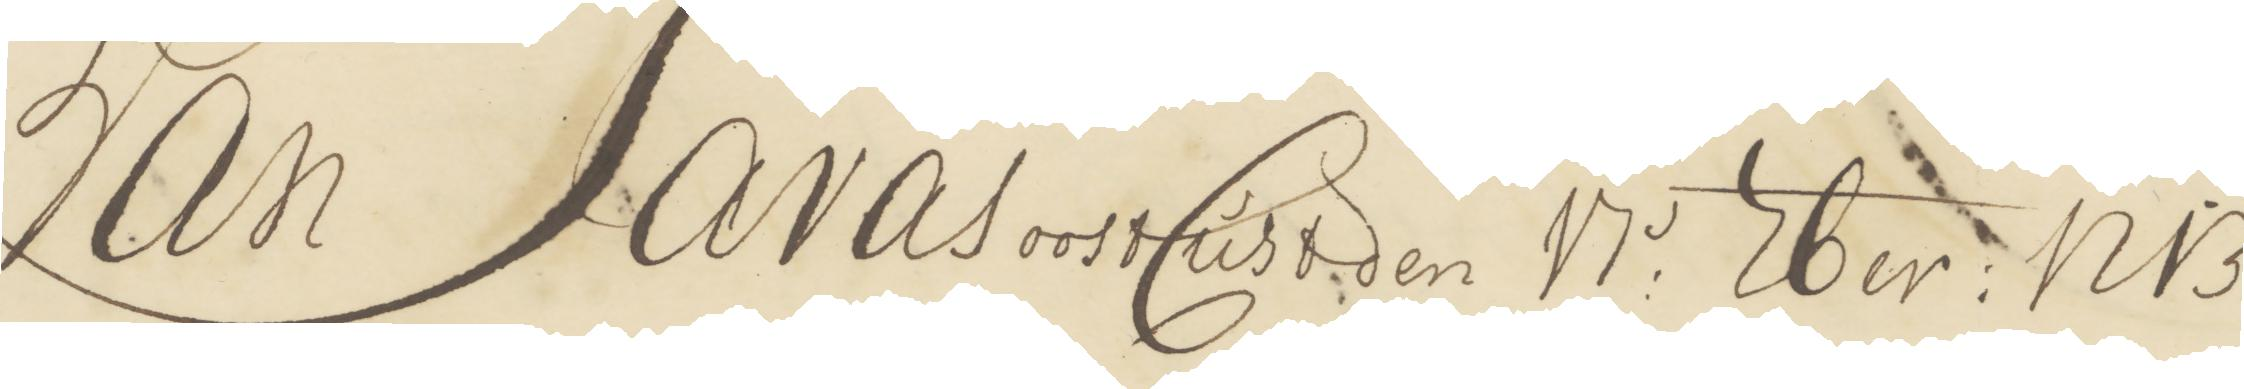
Van Javas oost Cust den 17:' 7ber: 1713
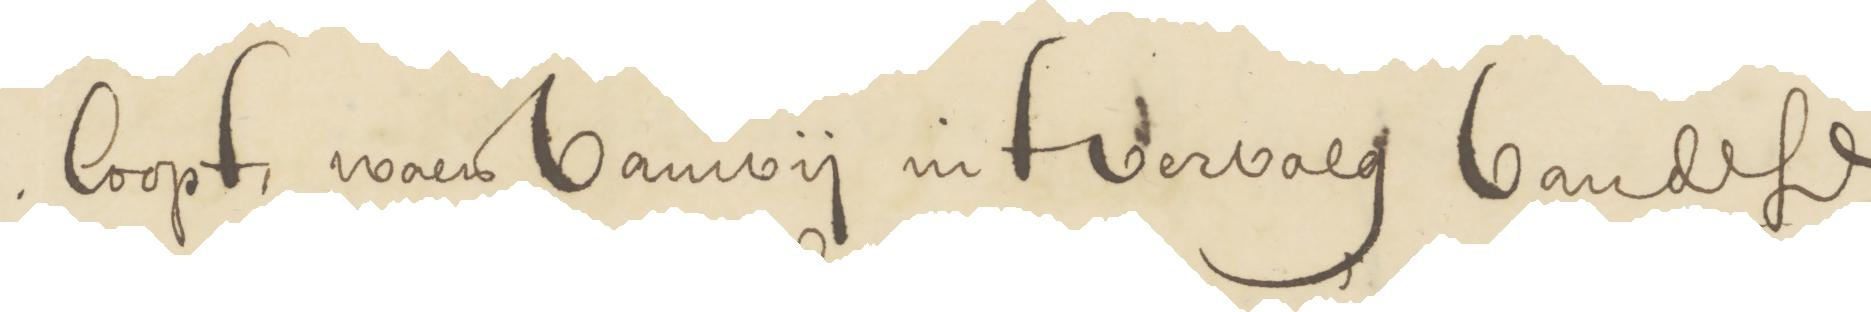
loopt, waervan wij in t vervolg vandese
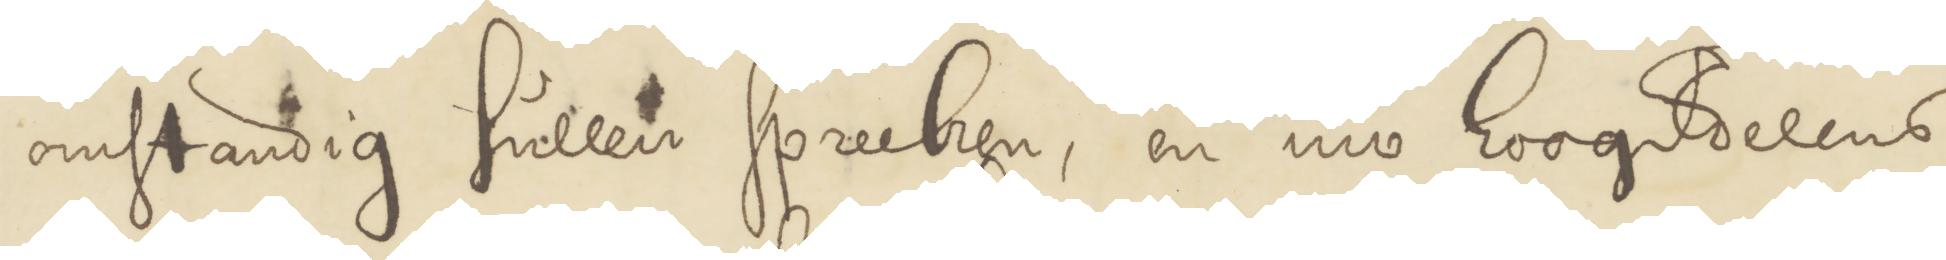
omstandig sullen spreeken, en uw hoog Edelens
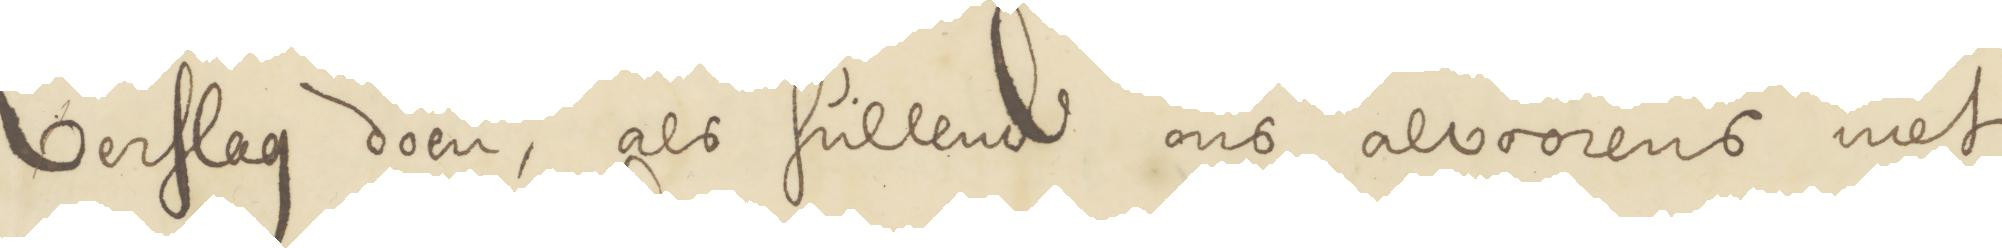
verslag doen, als sullende ons alvoorens met
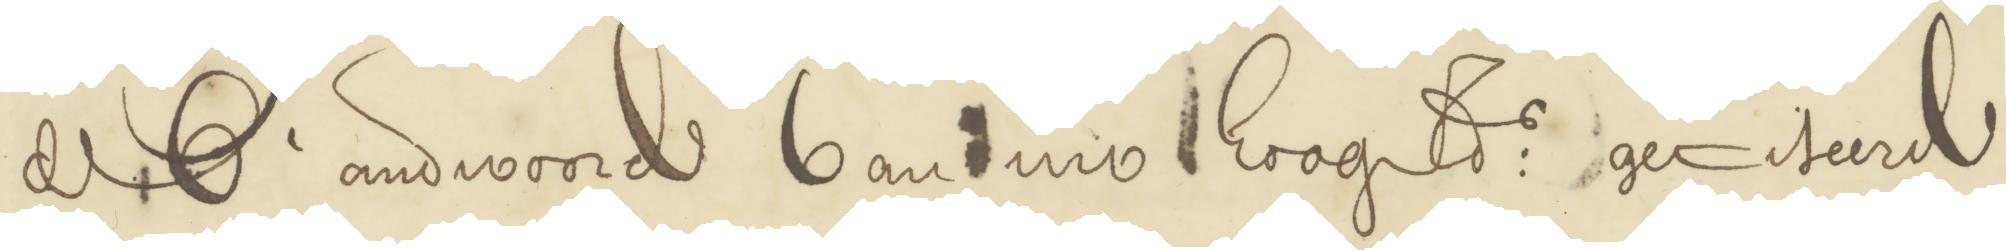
de b'andwoorde van uw hoog Ed:s geciteerde
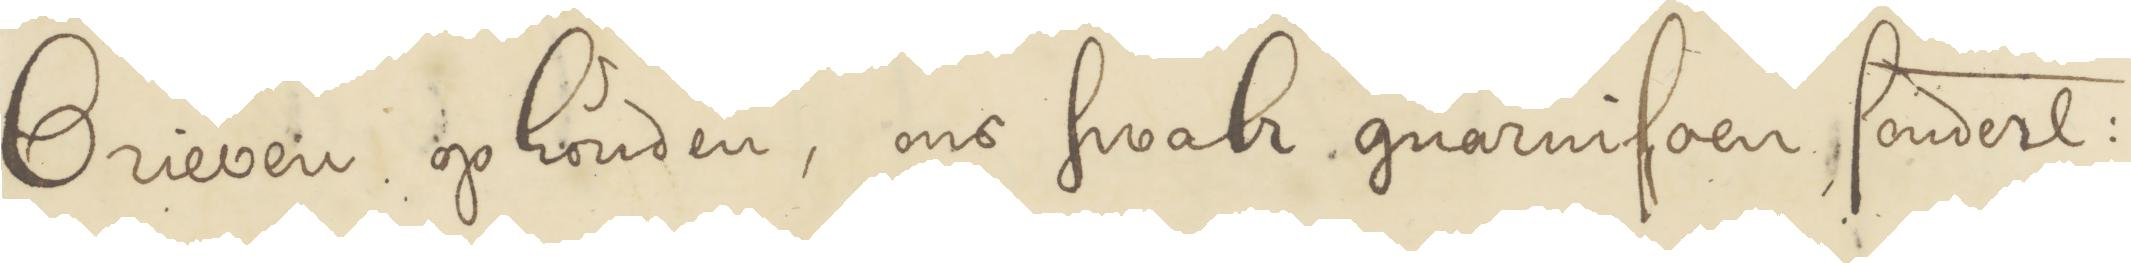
brieven ophouden, ons swak guarnisoen, sonderl:
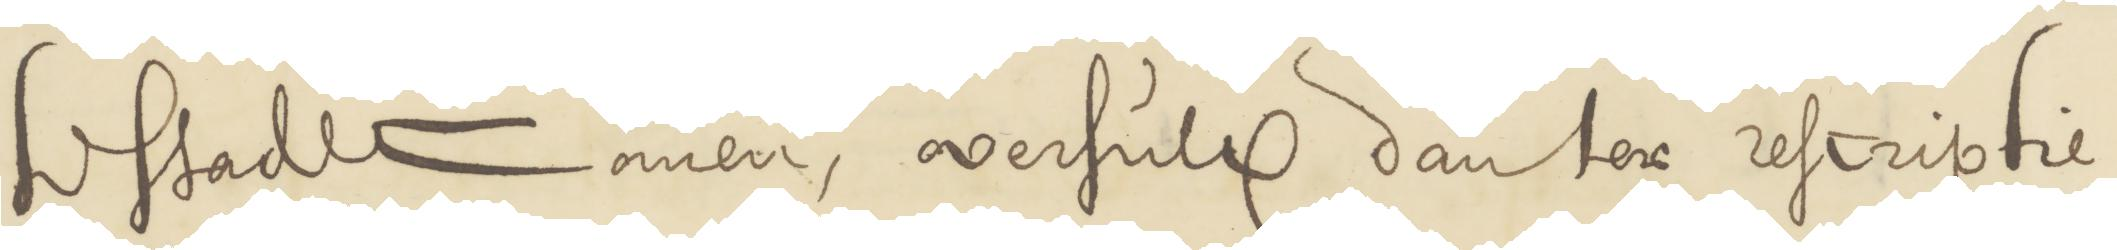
te stade comen, oversulx dan ter rescriptie
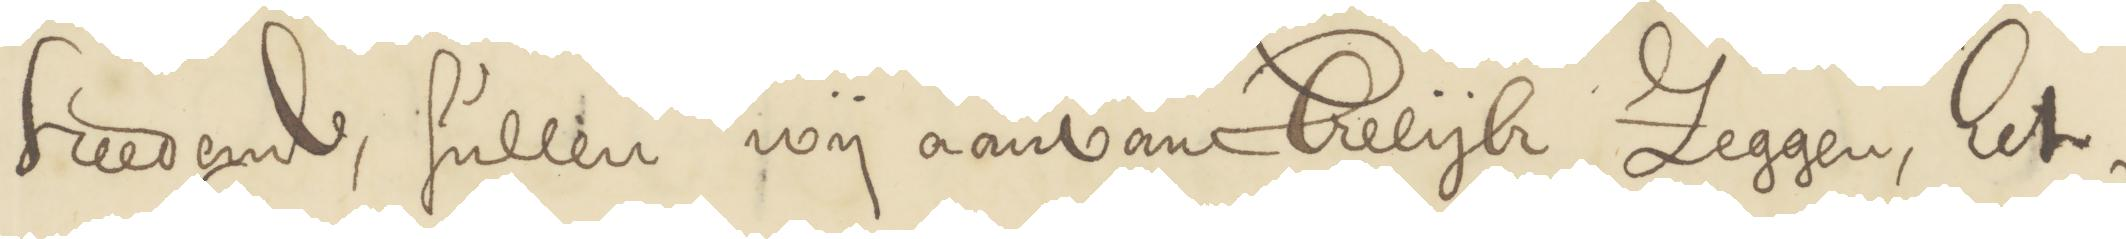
treedende, sullen wij aanvanckelijk zeggen, het
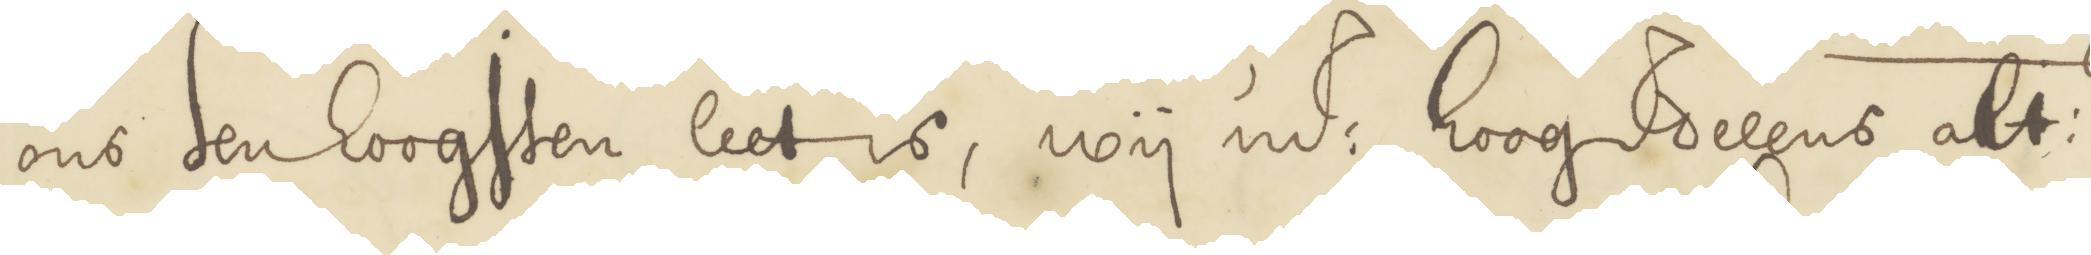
ons ten hoogsten leet is, wij uE: hoog Edelens alt:
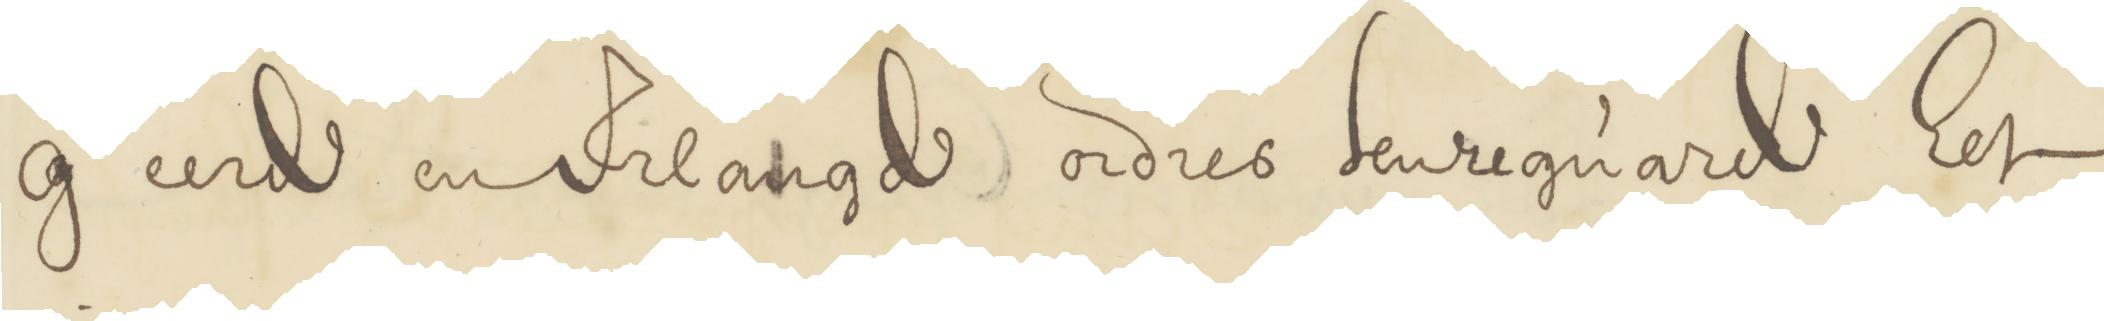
g’eerde en Erlangde ordres ten reguarde het
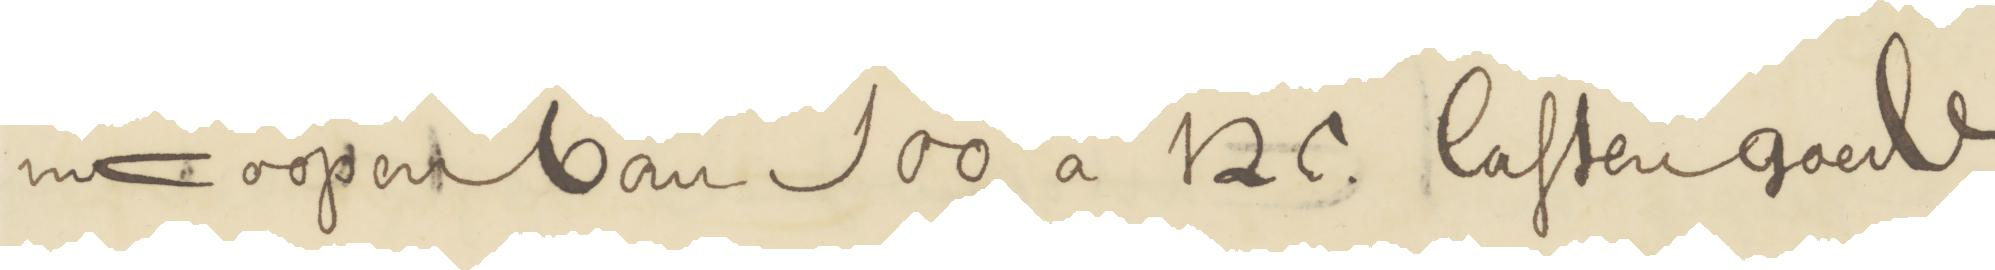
incoopen van 100 a 125. lasten goede
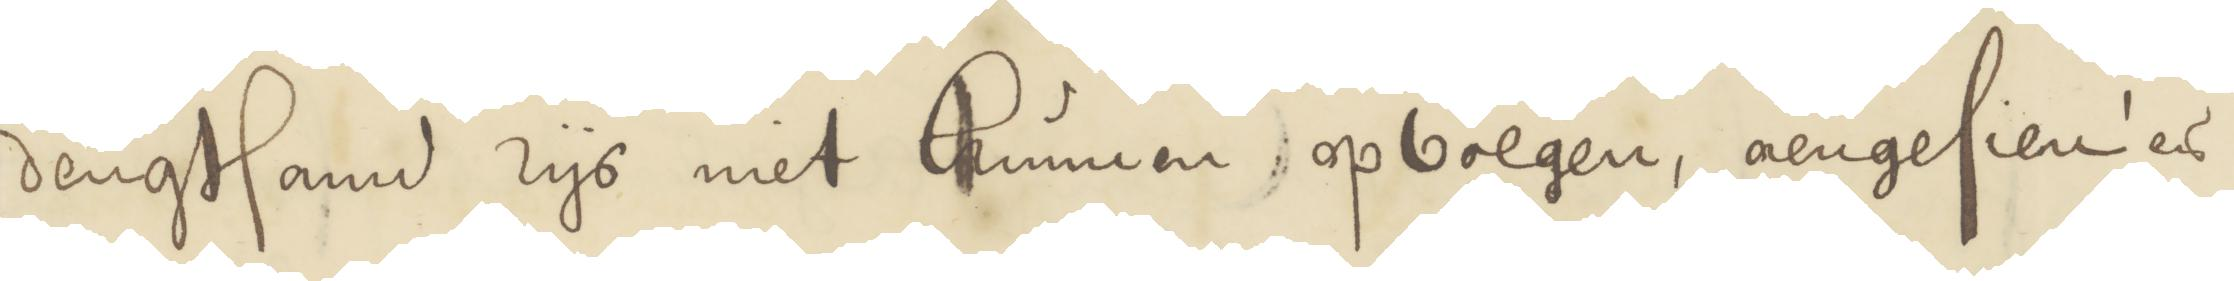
deugtsame rijs niet kunnen opvolgen, aengesien' er
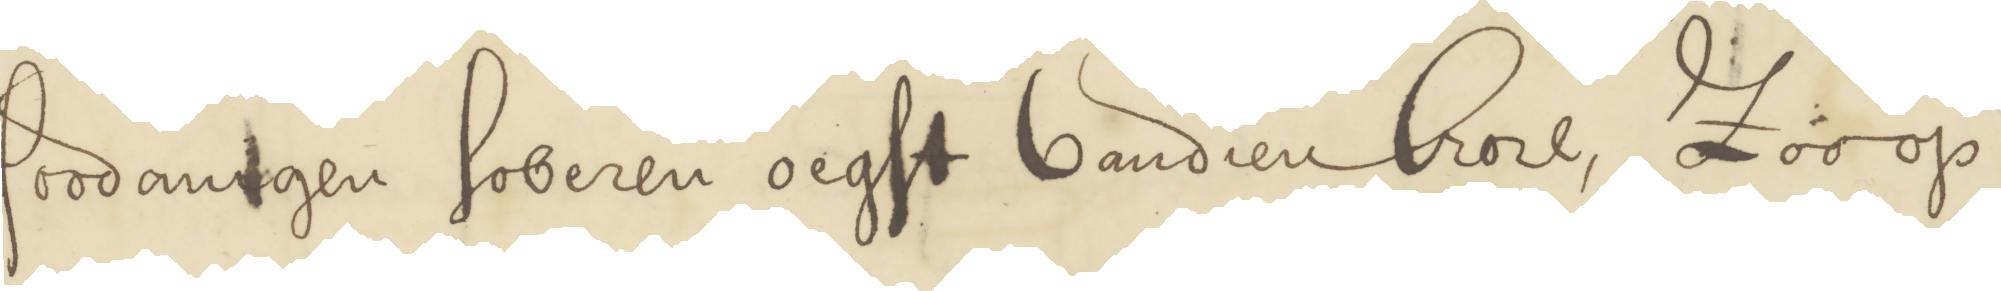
soodanigen soberen oegst van dien korl, zoo op
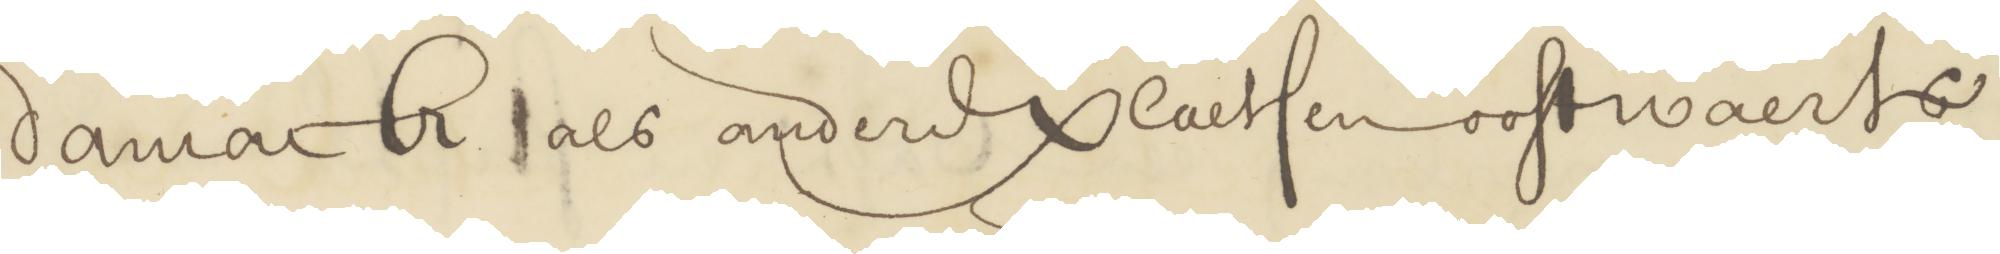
damack als andere plaetsen oostwaerts
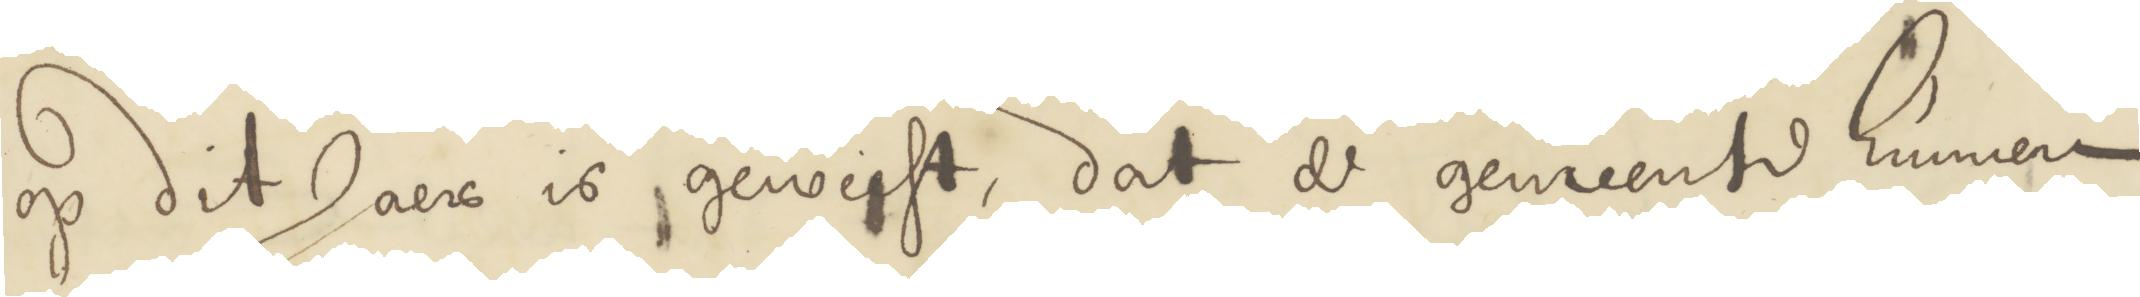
op dit Jaer is geweest, dat de gemeente hunnen
